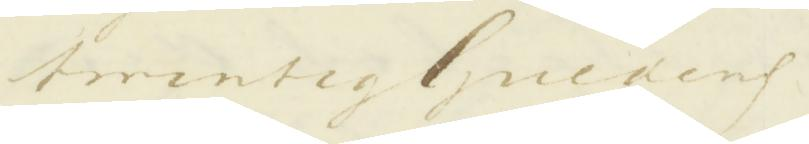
twintig Guldens
